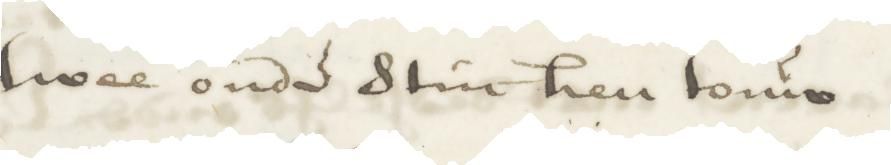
2.—. twee oude stucken touw
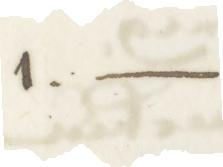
1.—.
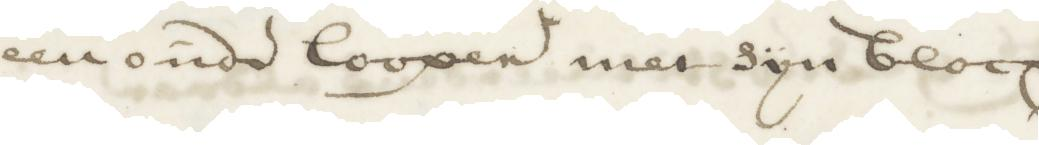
een oude looper met sijn blocx
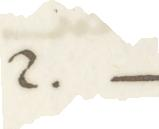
2.—.
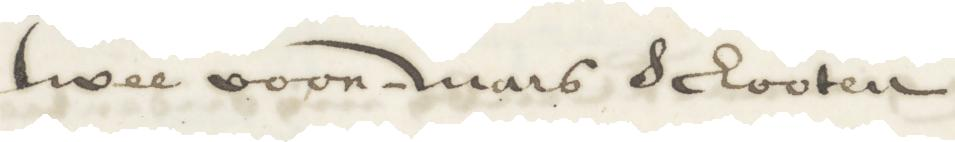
twee voor-mars schooten
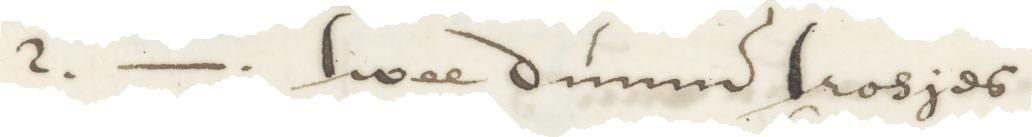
2. —. twee dunne trosjes
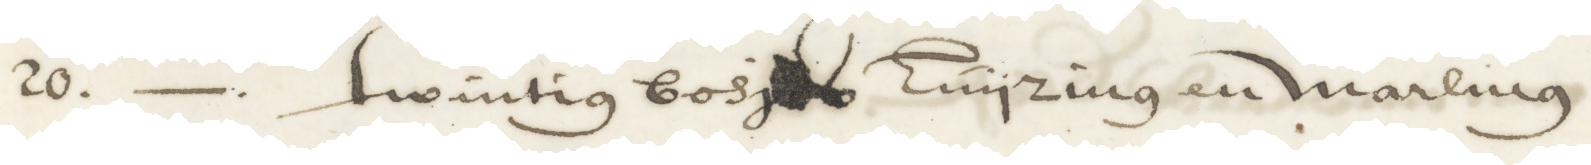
20. —. twintig bosjes huijzing en marling
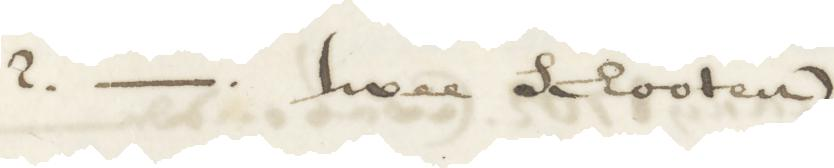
2. —. twee schooten }
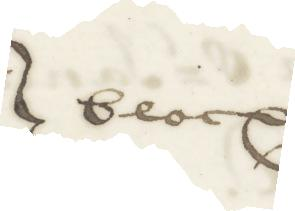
blocx
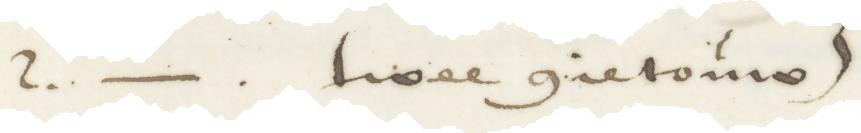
2.—. twee gietouw }
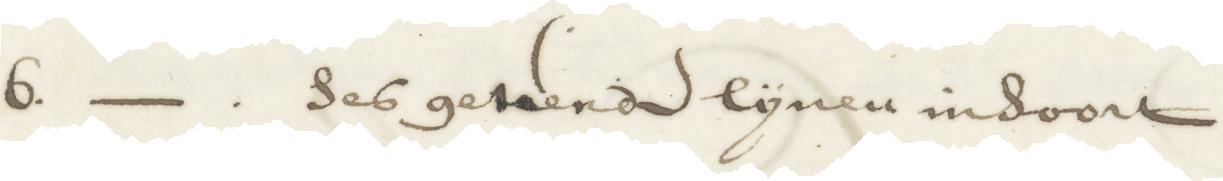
6. —. ses geteerde lijnen insoort
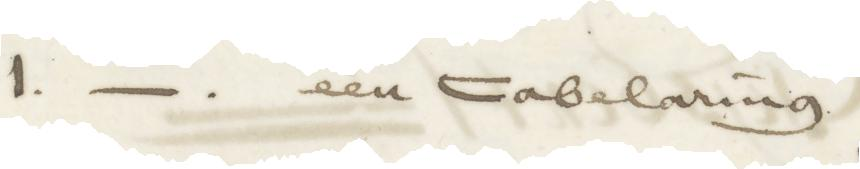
1. —. een Cabelaring.
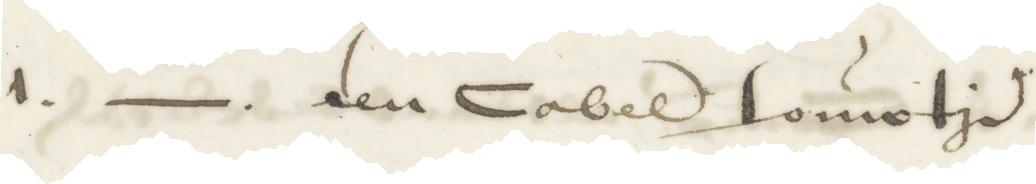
1. —. een cabel touwtje
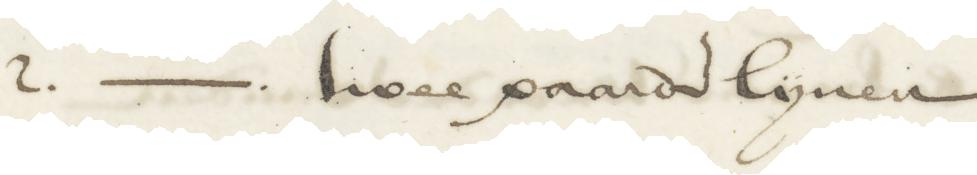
2. —. tvee paarde lijnen
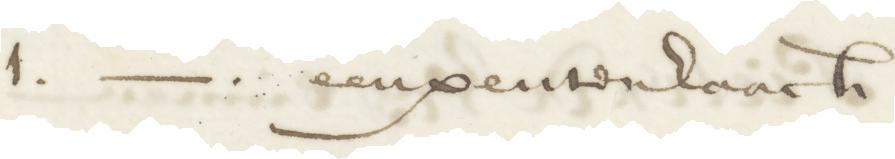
1. —. een penterhaack
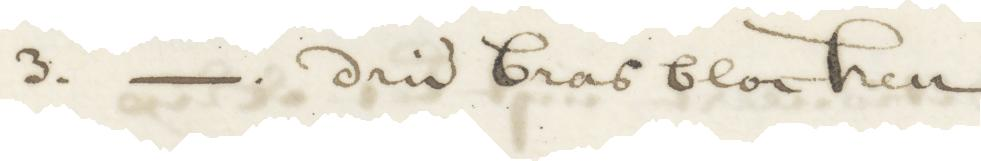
3. —. drie bras blocken
